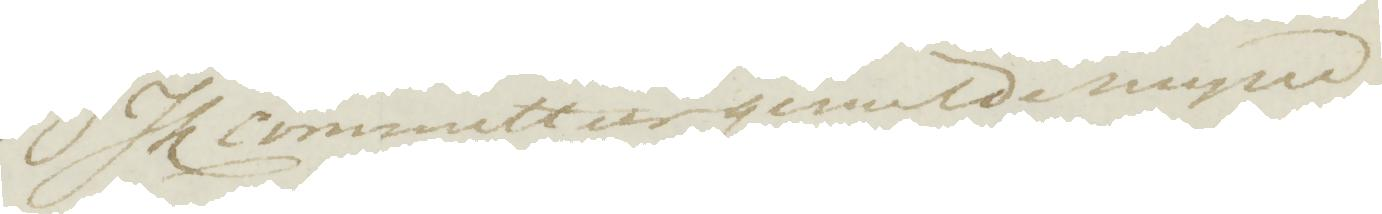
Ik committeer gemelde myne
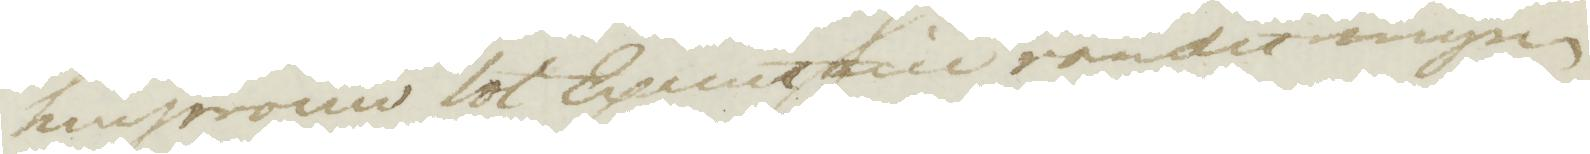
huisvrouw tot Executrice van dit myn
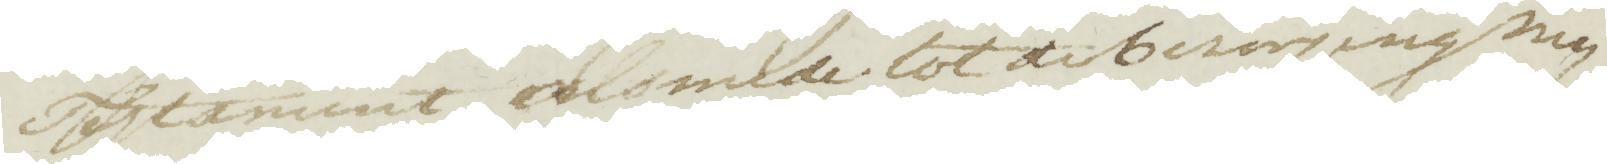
Testament alsmede tot de bezorging my
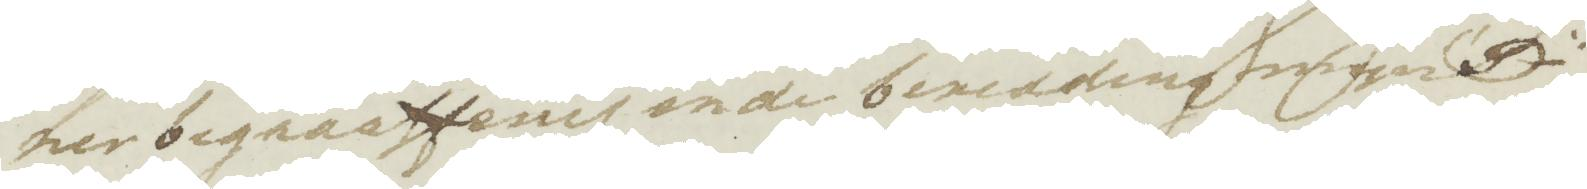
ner begraaffenis en de beredding myn In
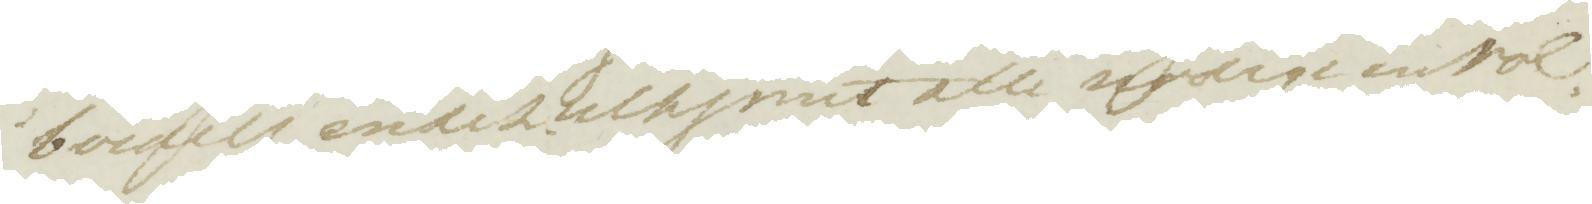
boedels en de zulksmet alle nodige en vol„
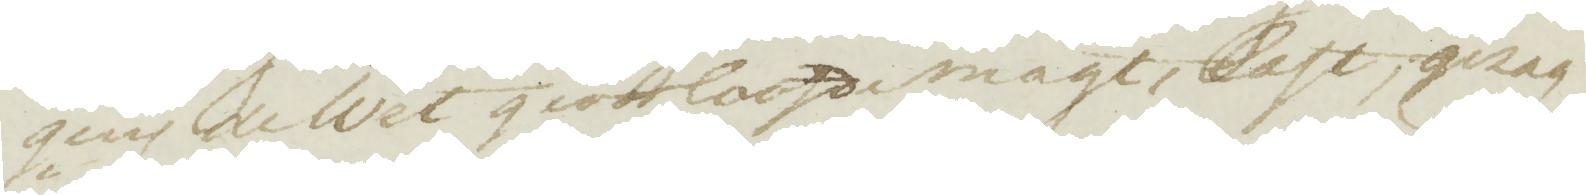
gens de wet geoorloofde magt, Last, gezag
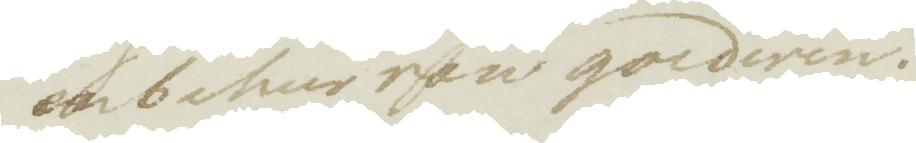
en beheer van goederen.
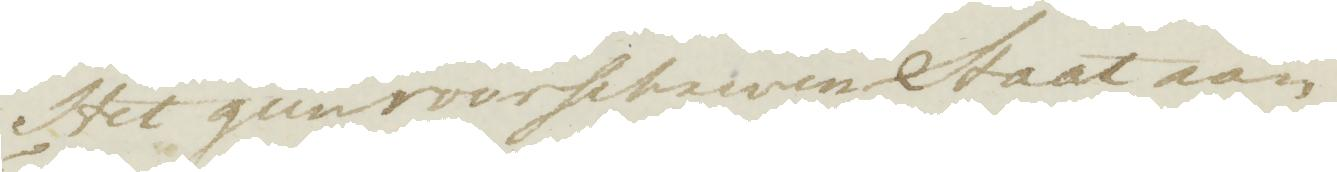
Het geen voorschreven staat aan
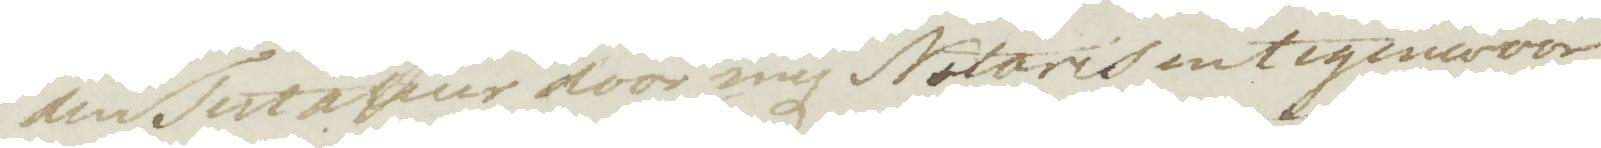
den Testateur door my Notaris in tegenwoor„
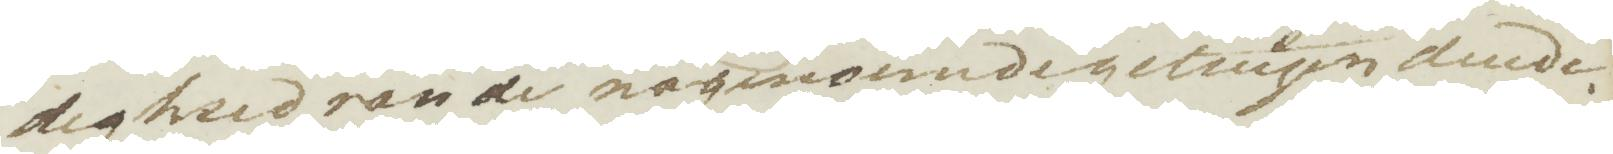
digheid van de nagenoemde getuigen duide„
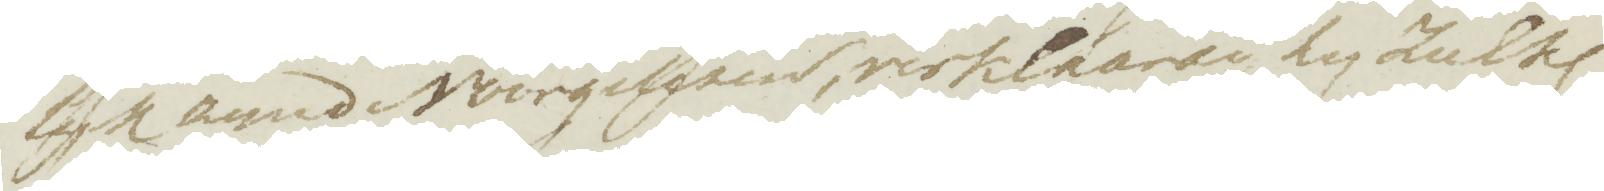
lyk zynde voorgelezen, verklaarde hij zulks
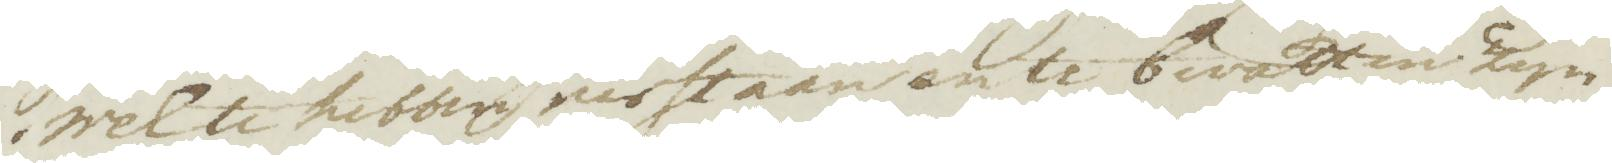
wel te hebben verstaan en te bevatten zijn
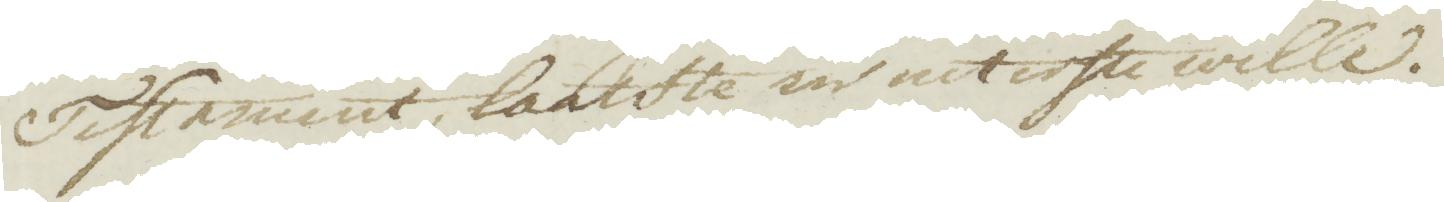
Testament, laatste en uiterste wille.
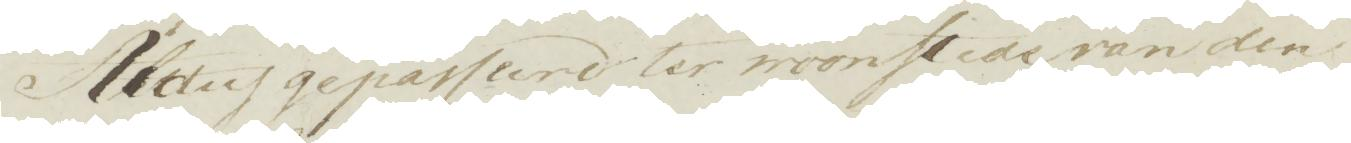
Aldus gepasseerd ter woonstede van den
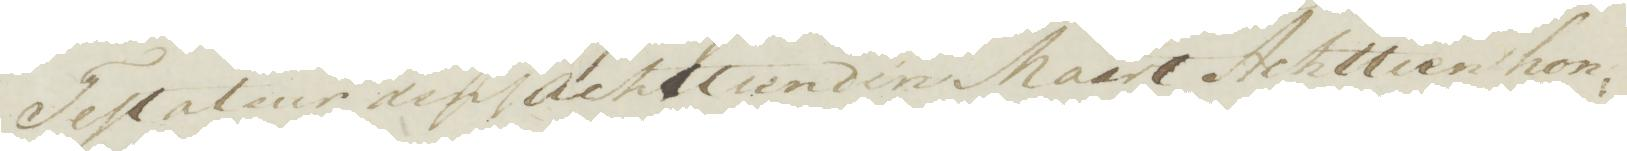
Testateur den Achttienden Maart Achttien hon„
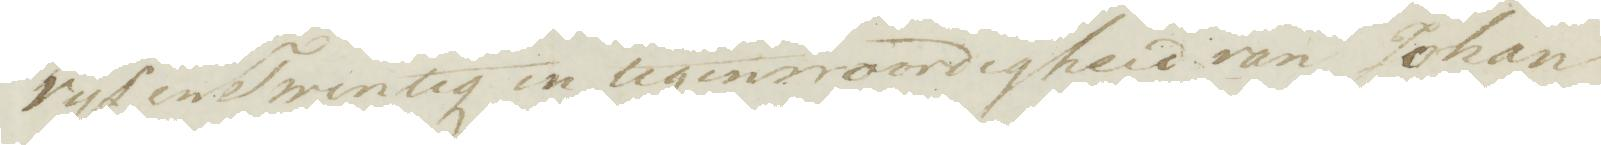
vijf en Twintig in tegenwoordigheid van Johan
